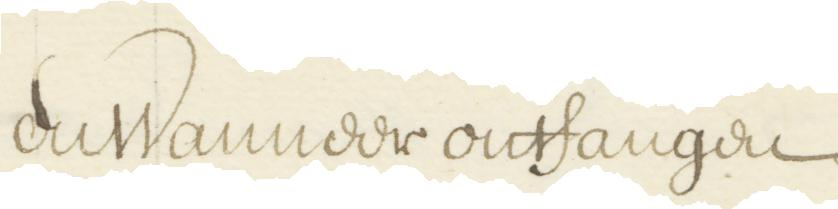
En Wanneer ontfangen
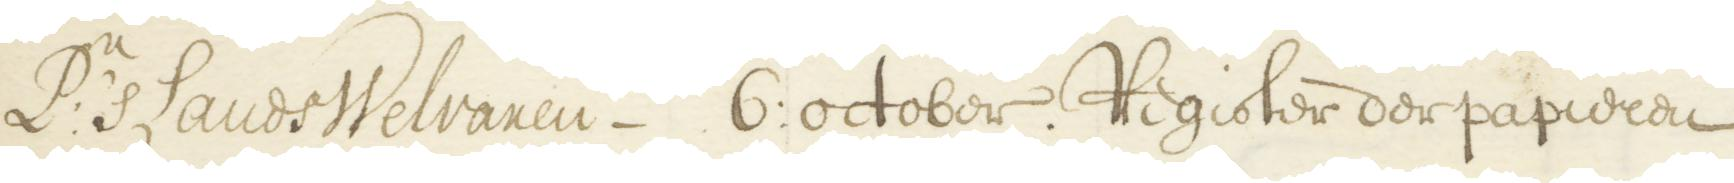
P:r 's Lands Welvaren - 6: october. Register der papieren
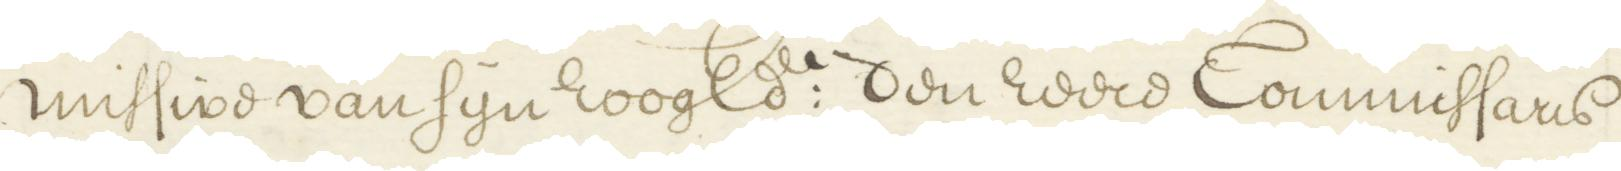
missive van sijn hoog Ed:le den heere Commissaris
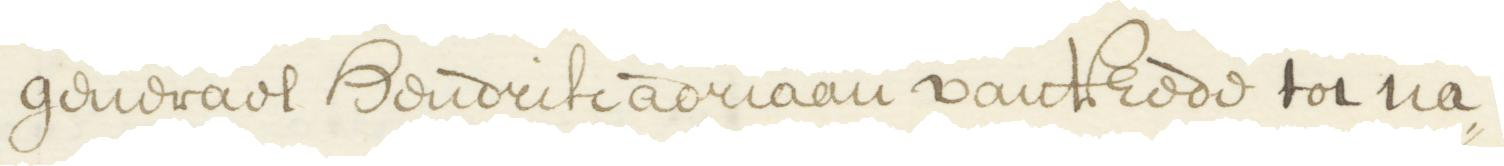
generael Hendrik adriaan van Rhede tot na„
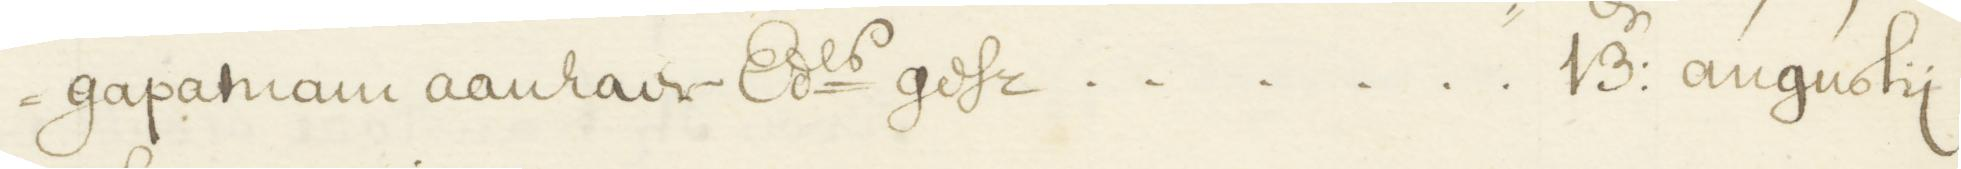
„gapatnam aan haer Ed=ls gesz. . . . . . 13:en augustij
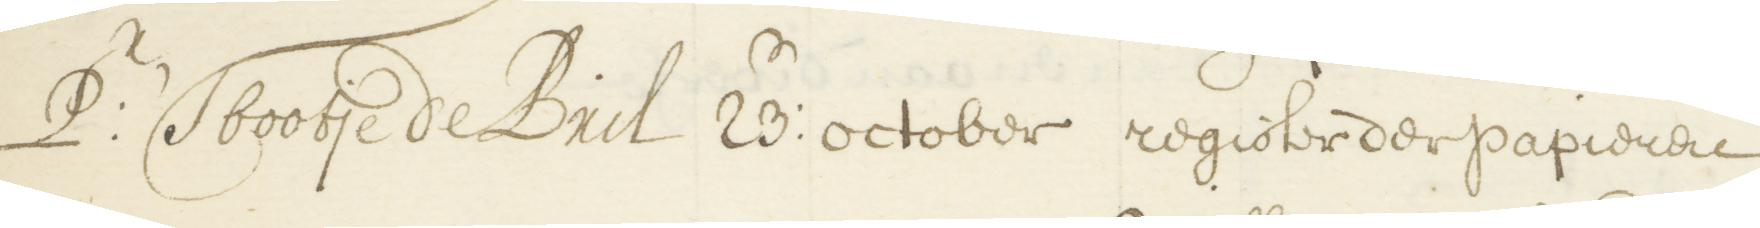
P:r 'T bootje de Bril 23: october register der papieren
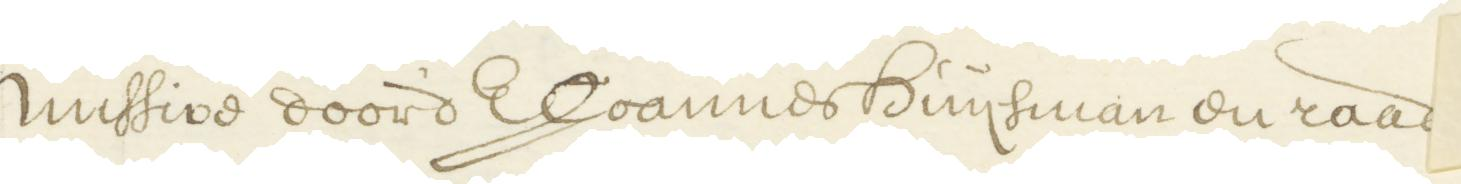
missive door 'd E Joannes Huijsman en raad
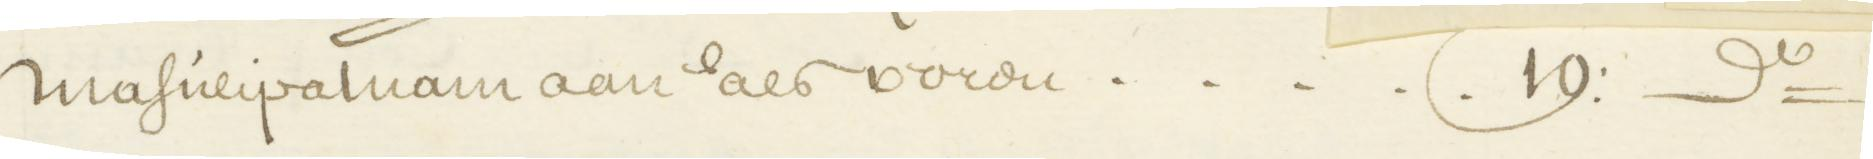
masulipatnam aan als voren . . . . . 19: _=o
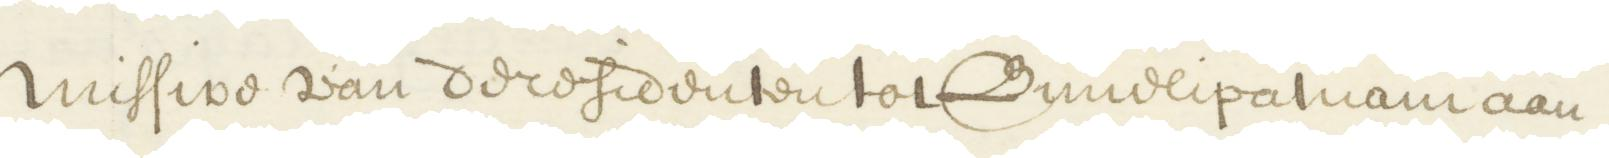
missive van deresidenten tot Dimelipatnam aan
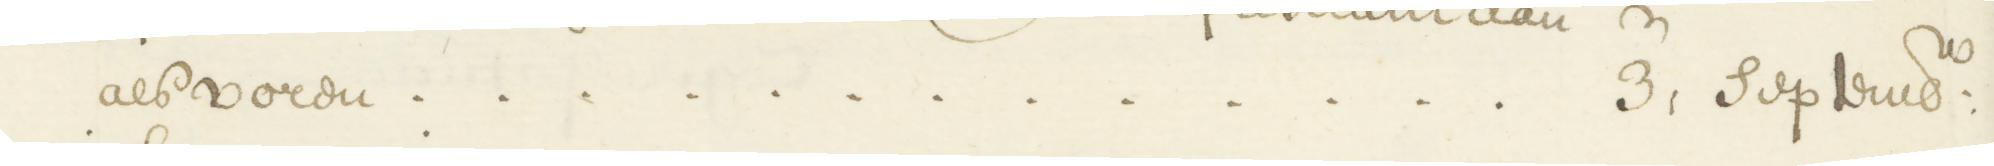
als voren . . . . . . . . . . . . . 3,' septemb:r
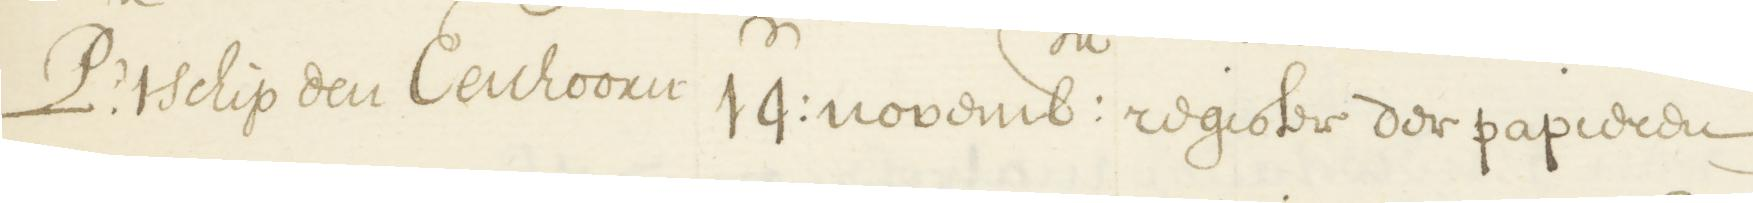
P:r 't schip den Eenhoorn 14:' novemb:r register der papieren
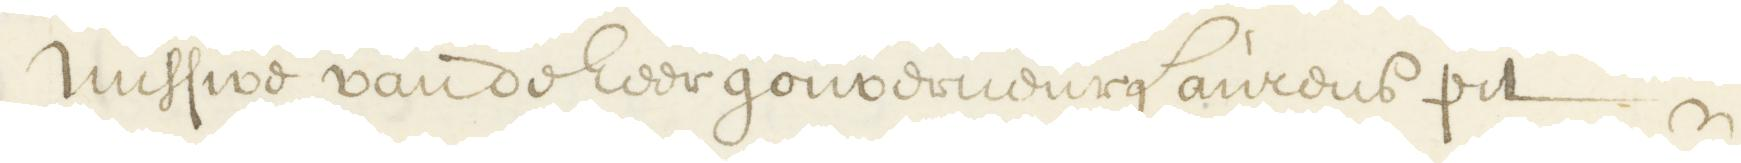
missive van de heer gouverneur Laurens pit
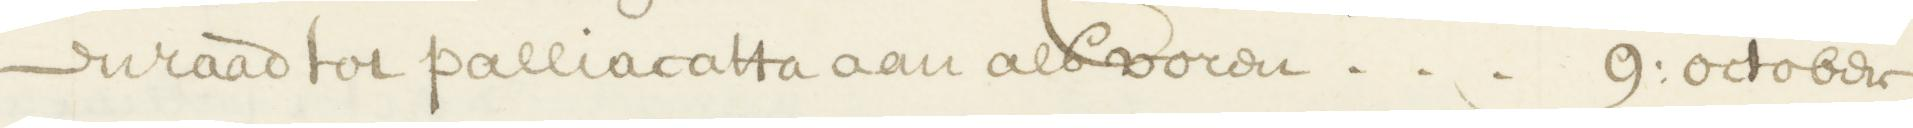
en raad tot palliacatta aan als voren . . . 9:' october
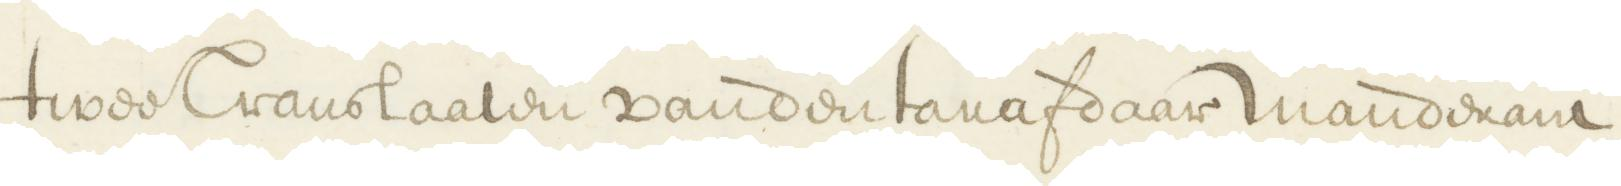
twee Translaaten van den tarafdaar manderant
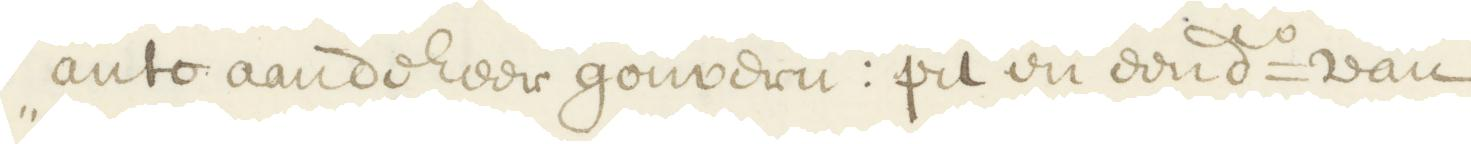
„anto: aan de heer gouvern:r pit en een d=o van
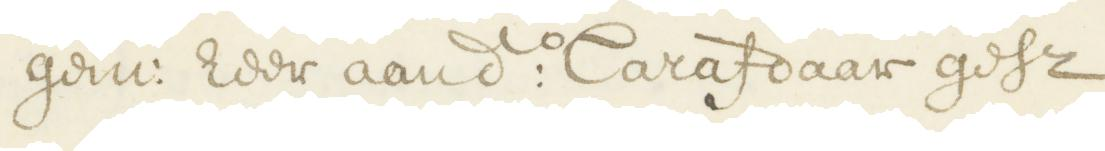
gem: heer aan d:to Tarafdaar gesz
